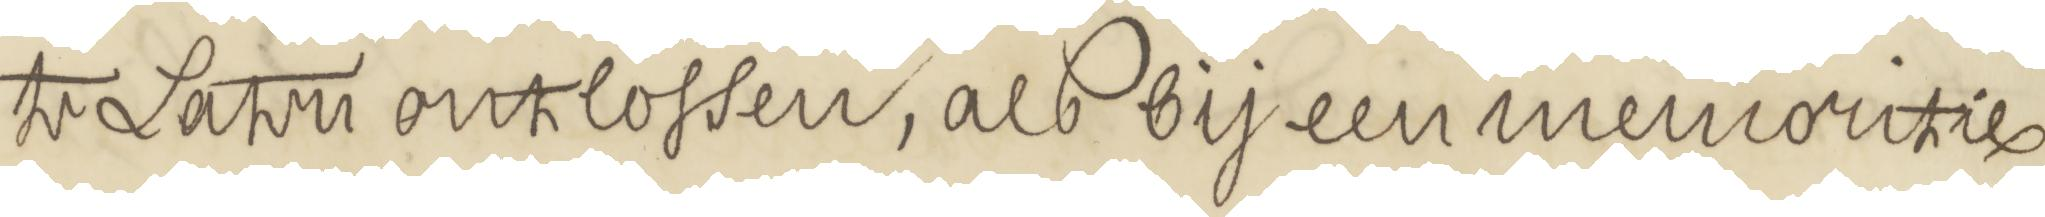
te Laten ontlossen, als bij een memoritie
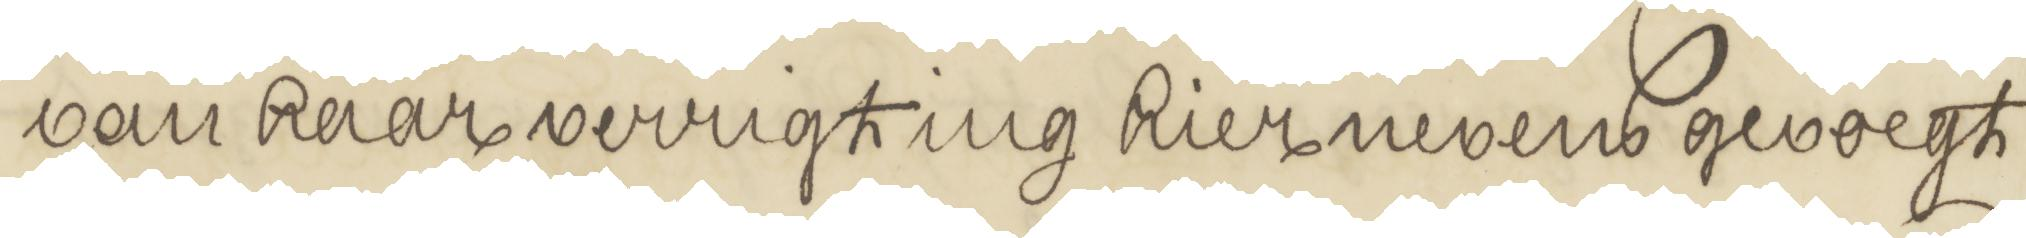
van haar verrigting hier nevens gevoegt
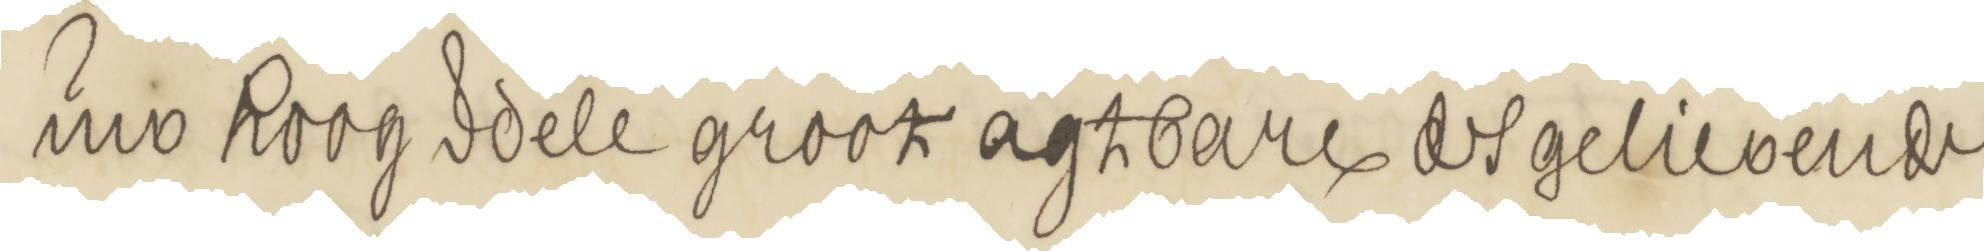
uw hoog Edele groot agtbare des gelievende
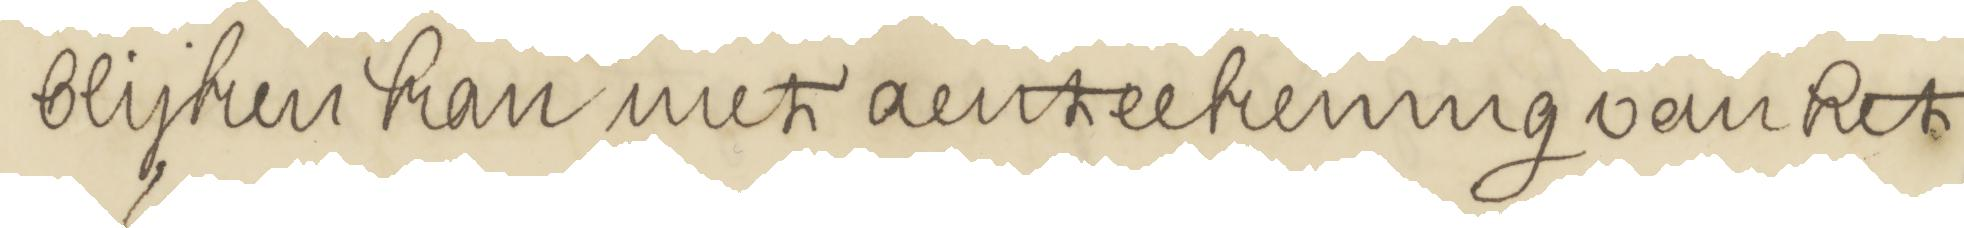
blijken kan met aenteekening van het
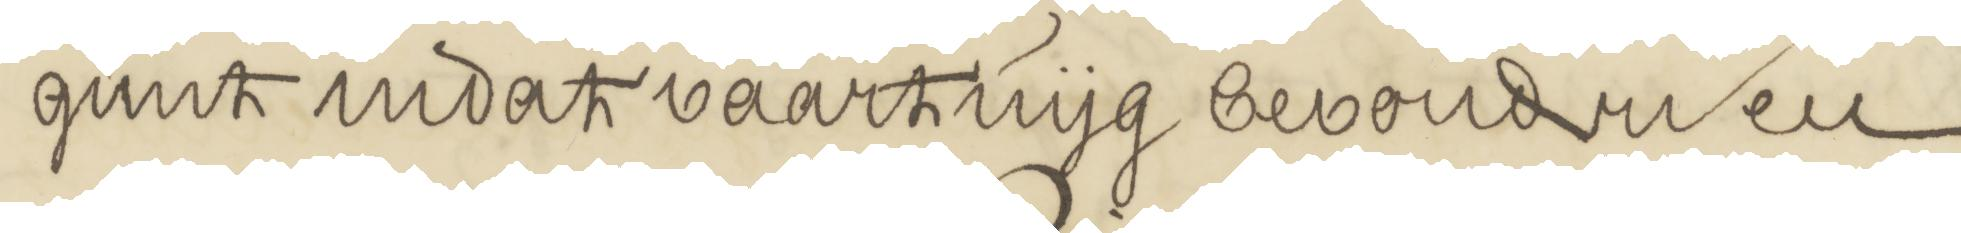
gunt indat vaartuijg bevonden en
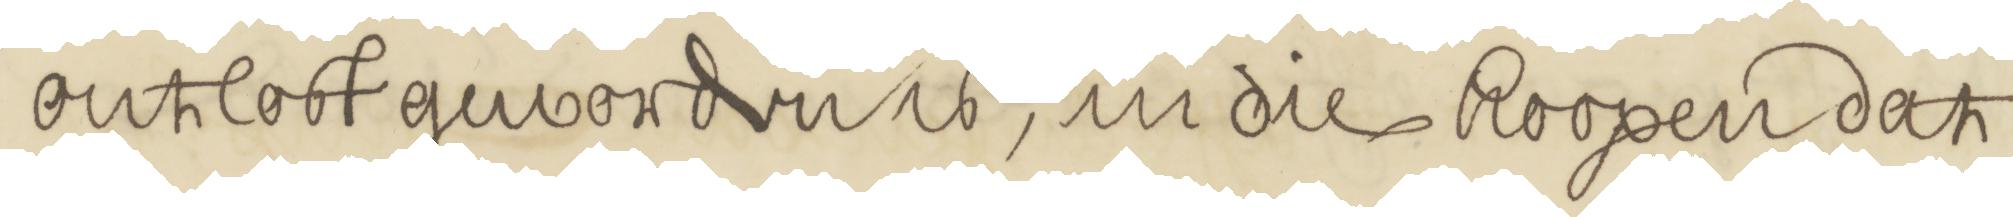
ontlost geworden is, in die hoopen dat
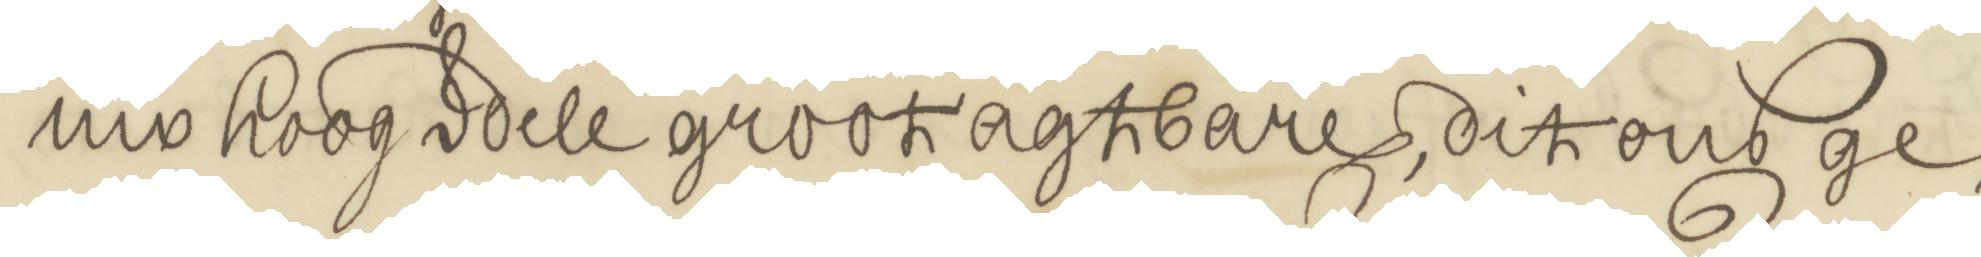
uw hoog Edele groot agtbare, dit ons ge„
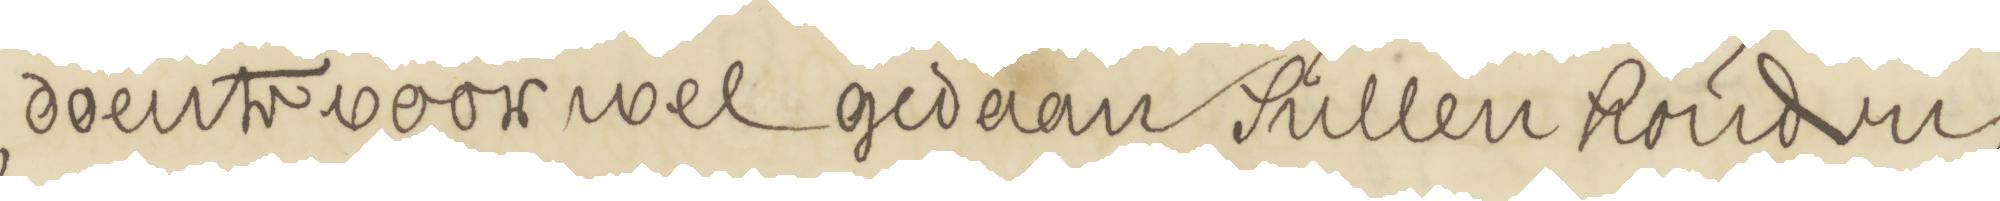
„doente voor wel gedaan sullen houden
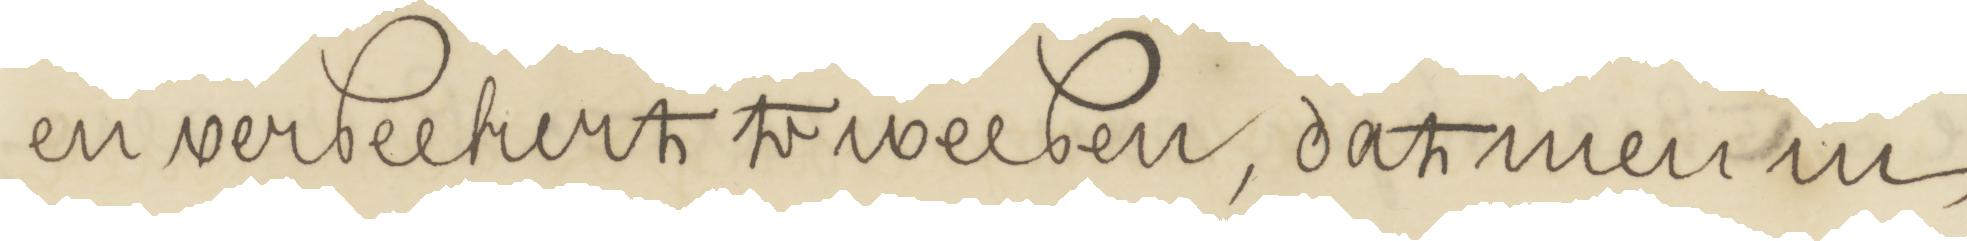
en verseekert te weesen, dat men in
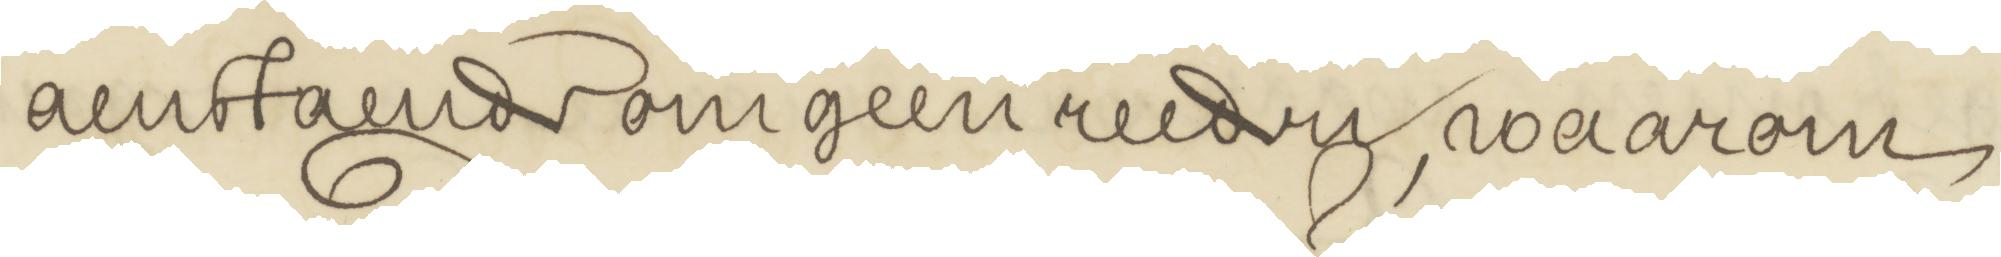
aenstaende om geen reeden, waarom
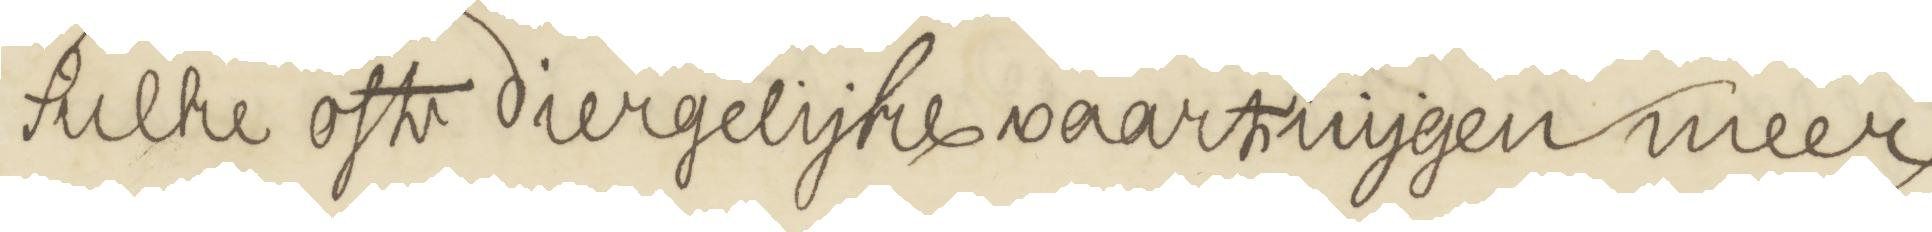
sulke ofte diergelijke vaartuijgen meer
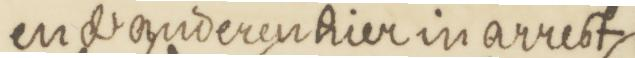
en de anderen hier in arrest
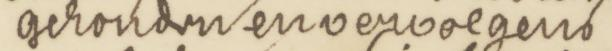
gehouden en vervolgens
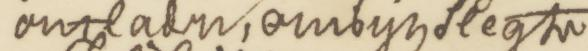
ontladen, omsijn slegte
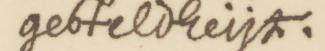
gesteldheijt.
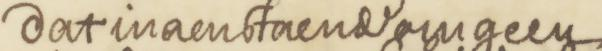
dat in aenstaende omgeen
